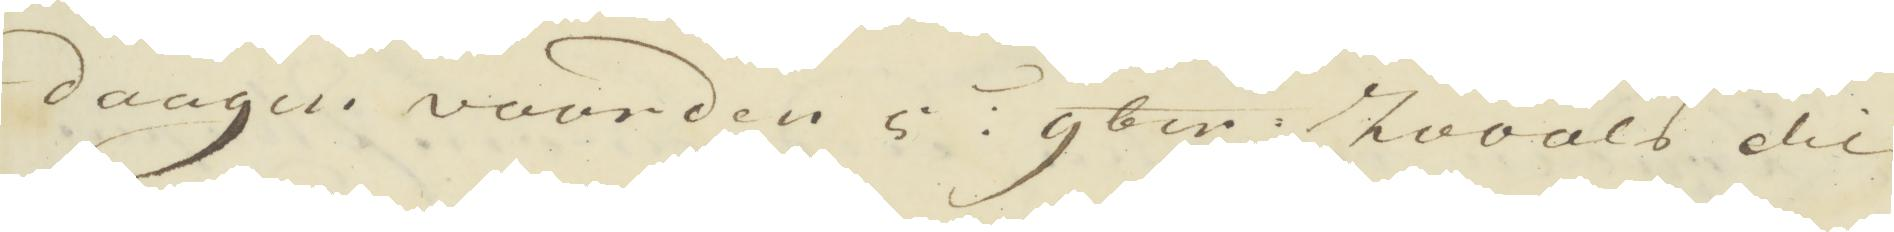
daagen voor den 5:' 9ber: zoo als die
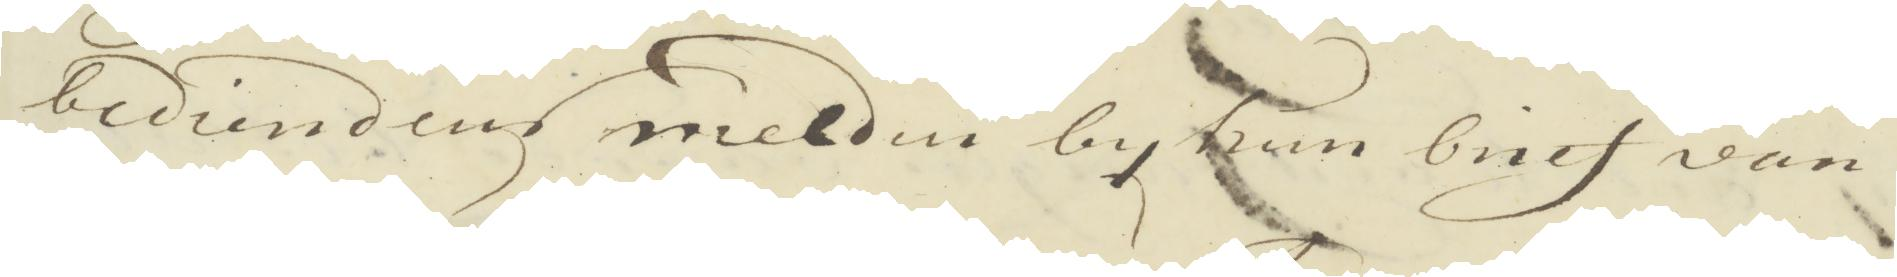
bediendens melden by hun brief van
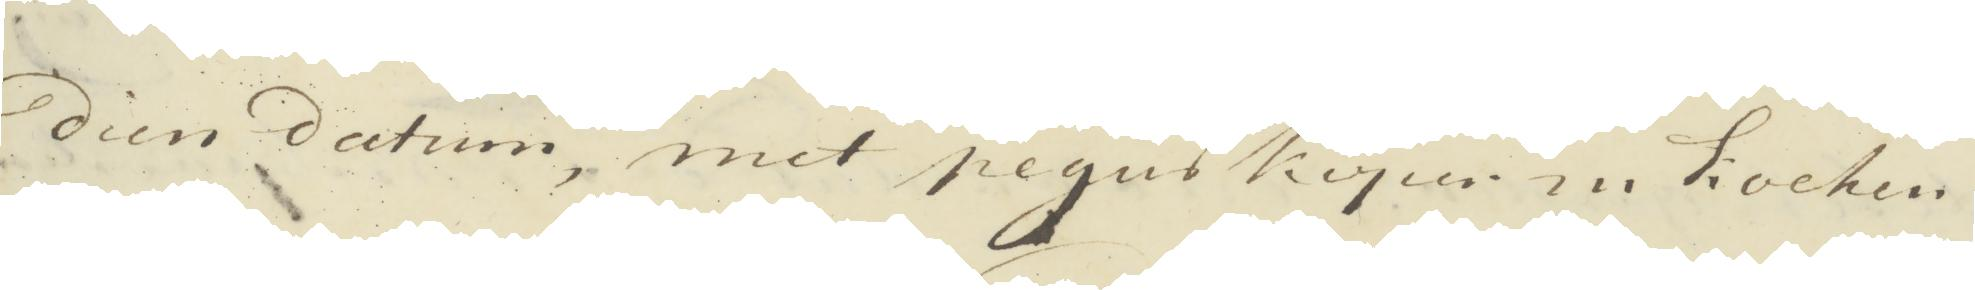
dien datum, met pegus koper in koeken
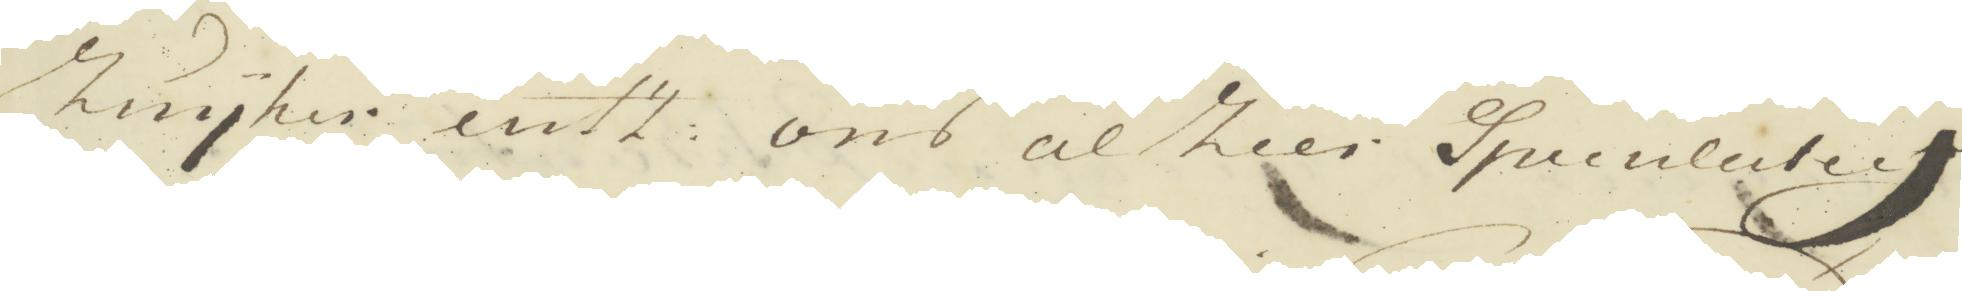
zuijker ensz: ons al zeer speculatief
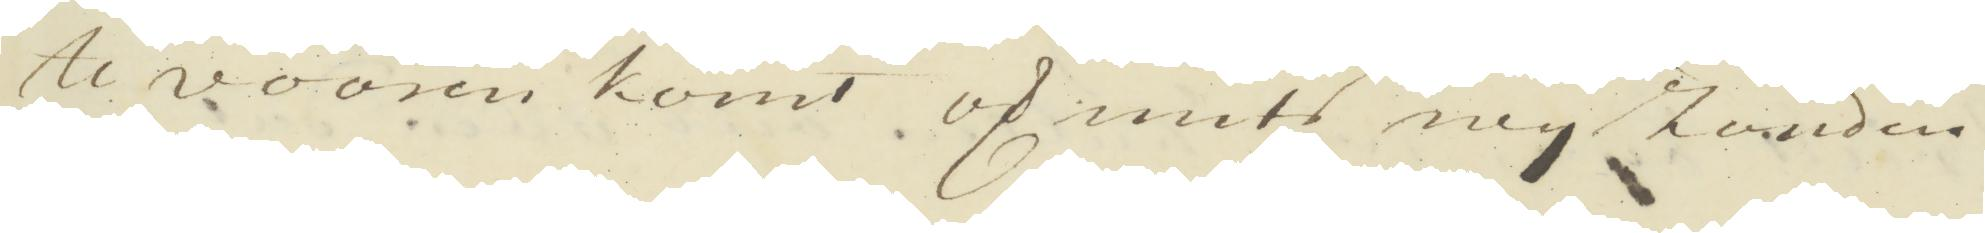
te vooren komt overmits wy zouden
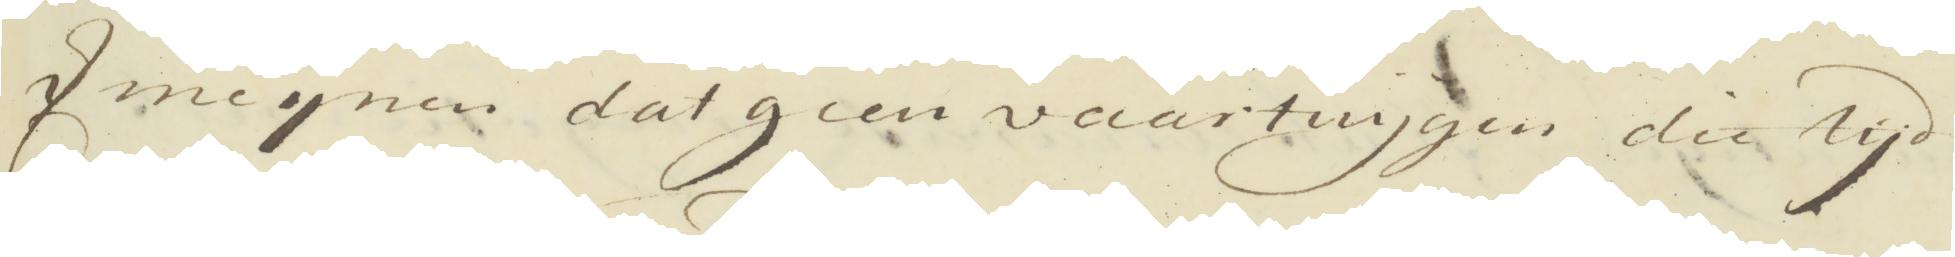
vermeijnen dat geen vaartuijgen die tijd
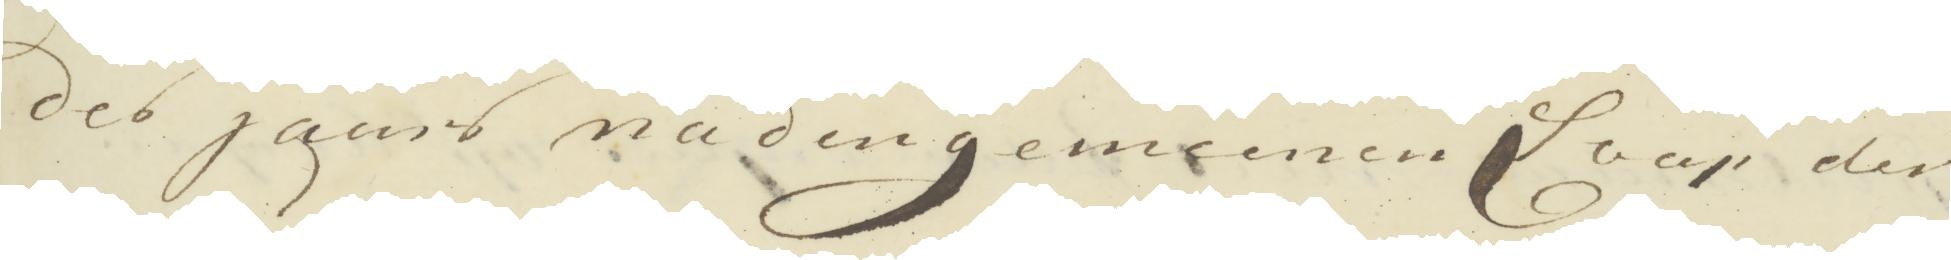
des jaars na den gemeenen Loop der
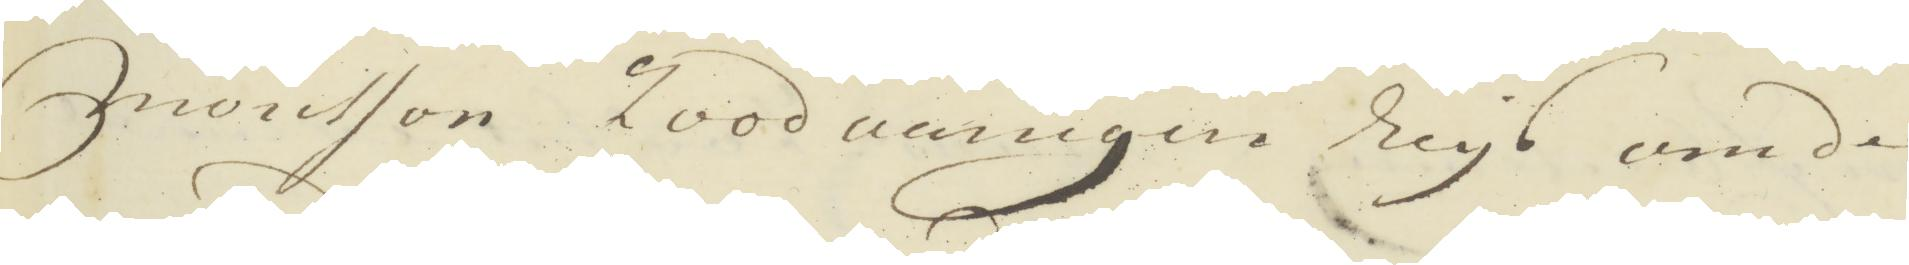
monsson zoodaanigen reijs om de
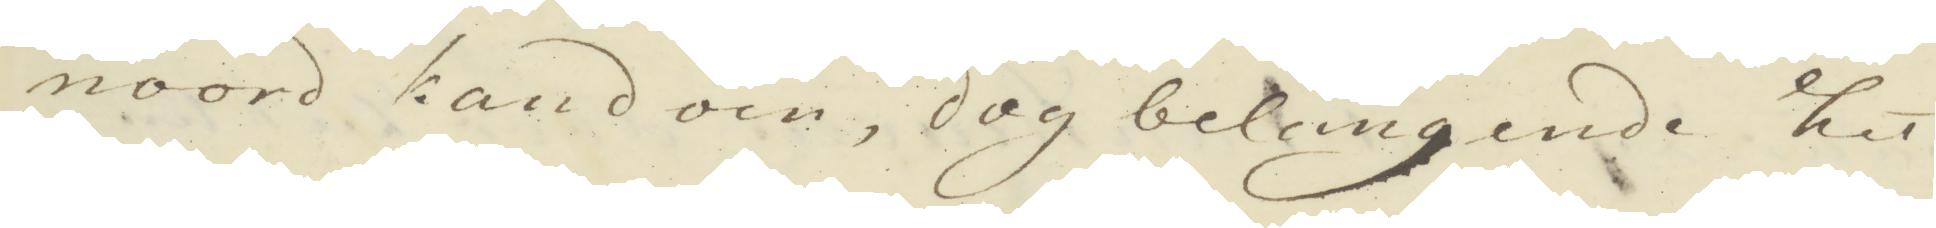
noord kand om, dog belangende het
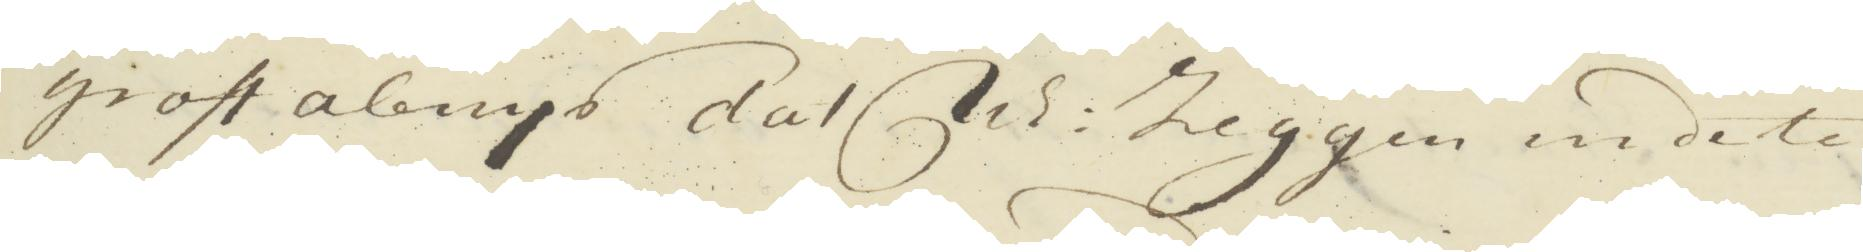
groff abuijs dat UE: zeggen in de te
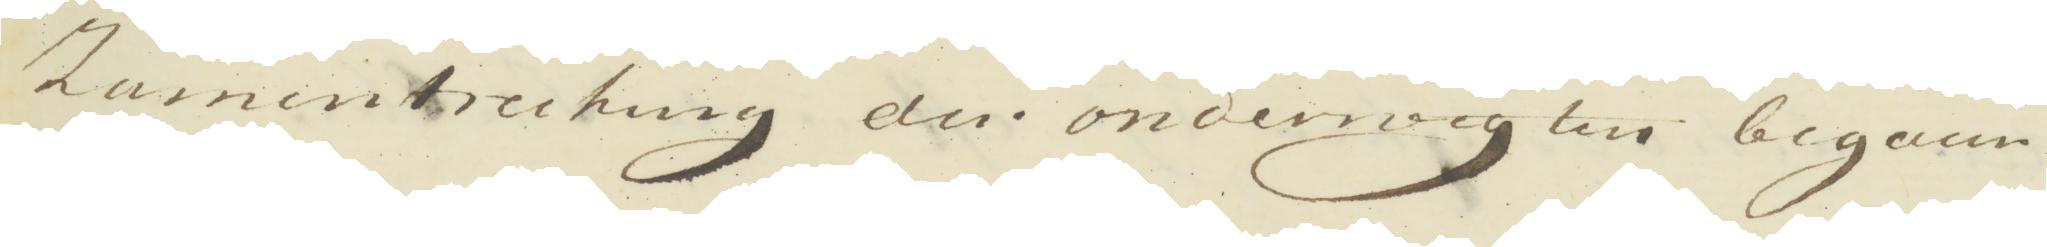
zamentrecking der onderwigten begaan
